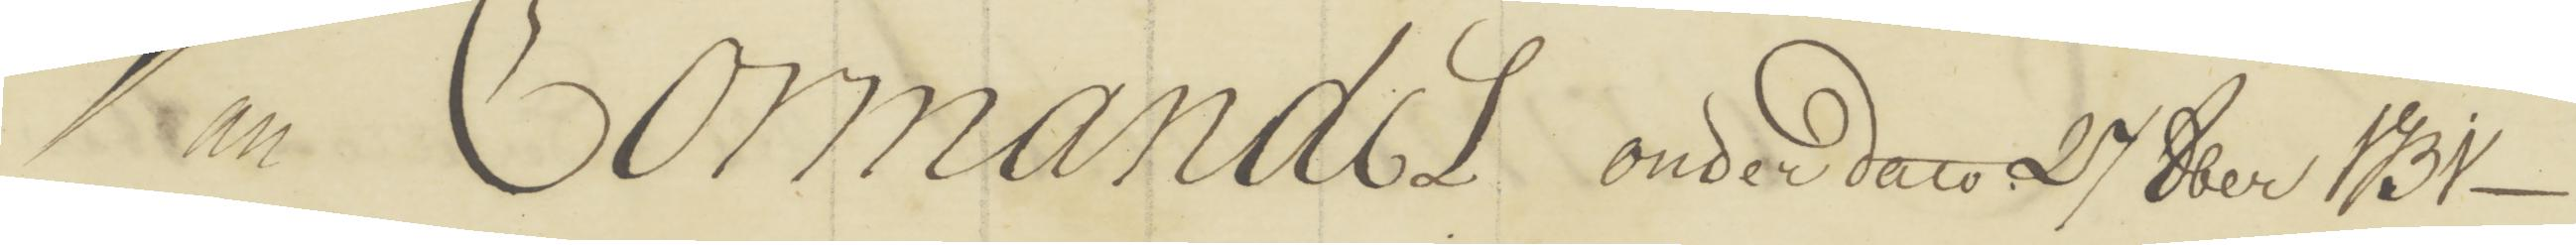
Van Cormandel onder dato 27 8ber 1731 —
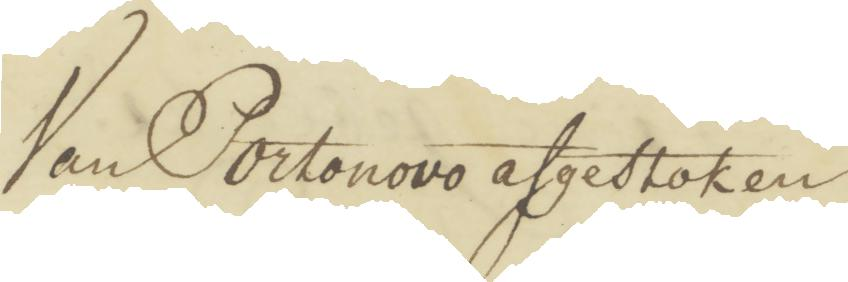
Van Portonovo afgestoken
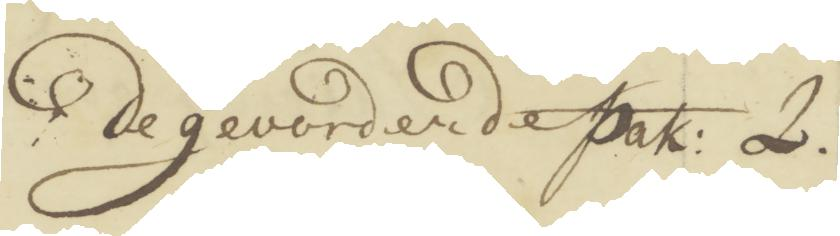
de gevorderde pak: 2.
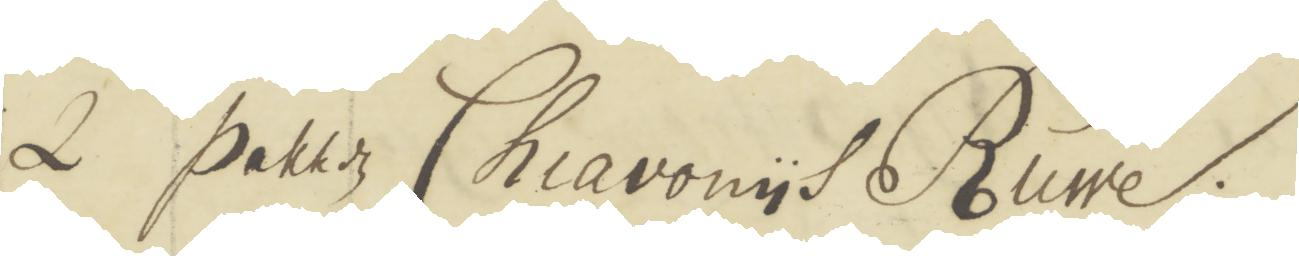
2 pakken Chiavonijs Ruwe;
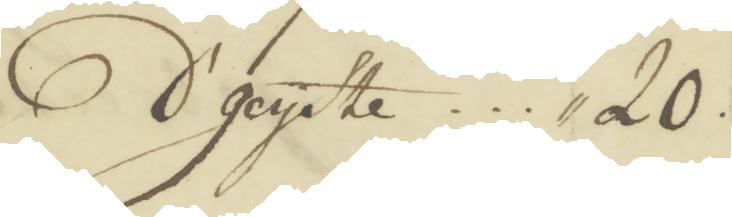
d'geijste . . . „ 20
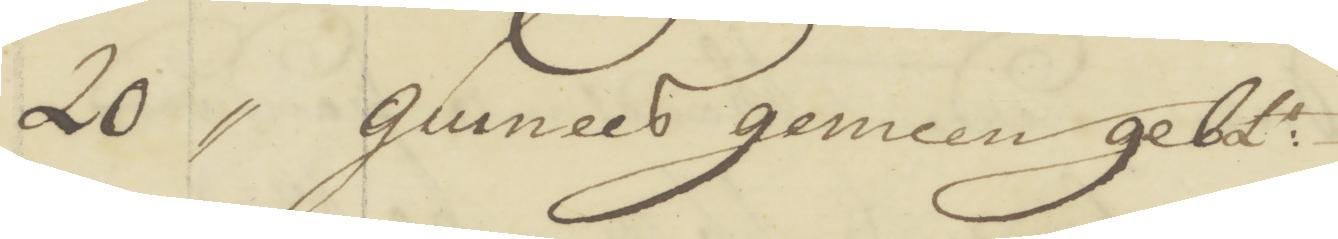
20 „ guinees gemeen gebl:t
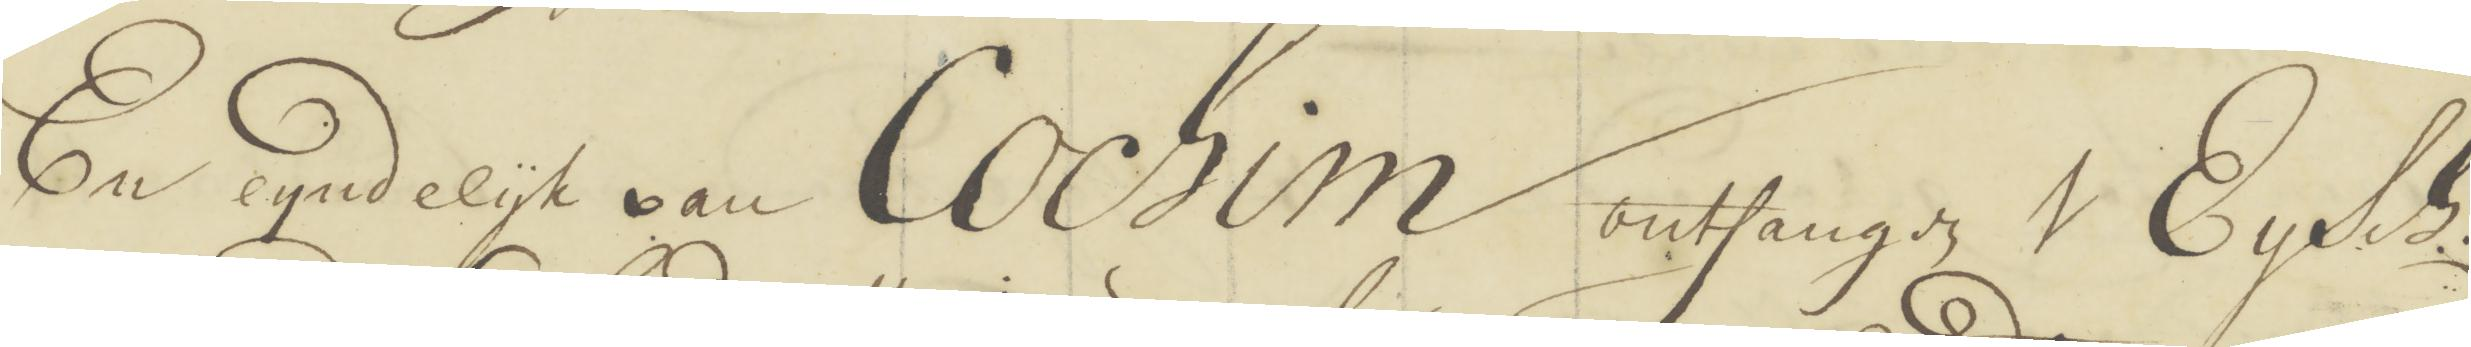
En eyndelijk van Cochim ontfangen 1 Eysch:
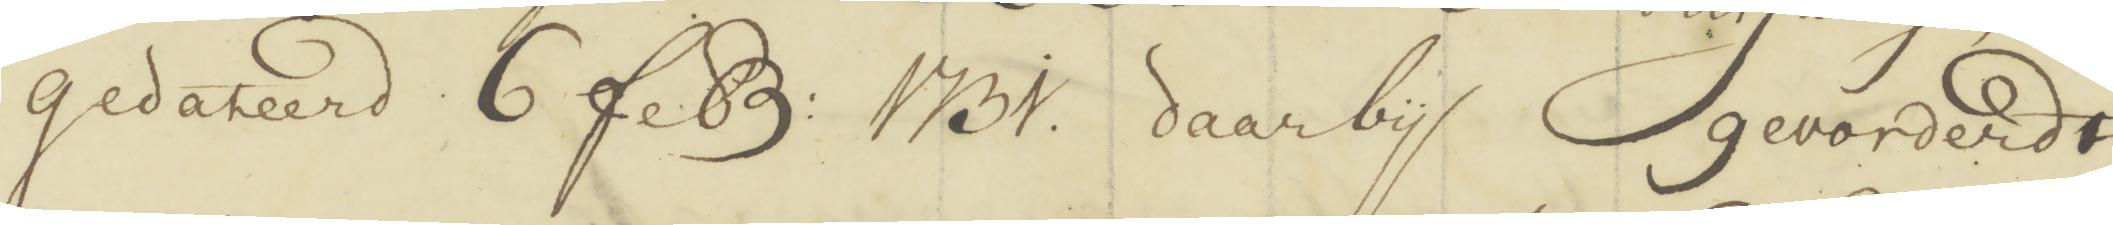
gedateerd 6 feb: 1731. daarbij gevorderdt
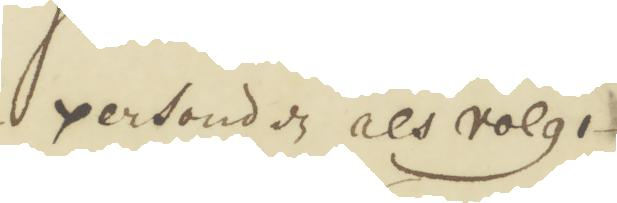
versonden als volgt
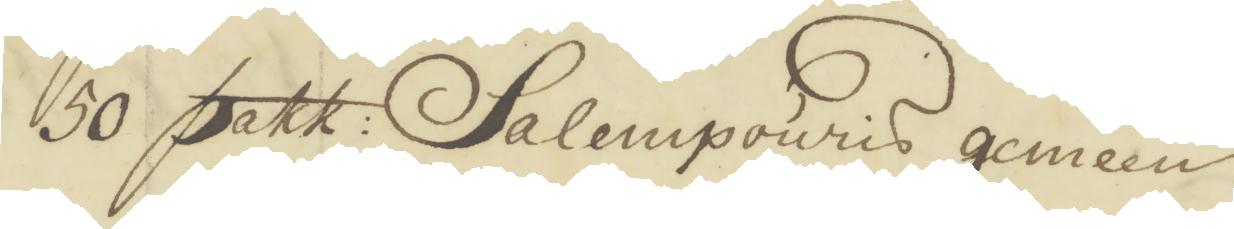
50 pakk: Salempouris gemeen
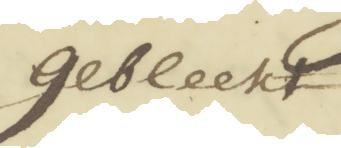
gebleekt
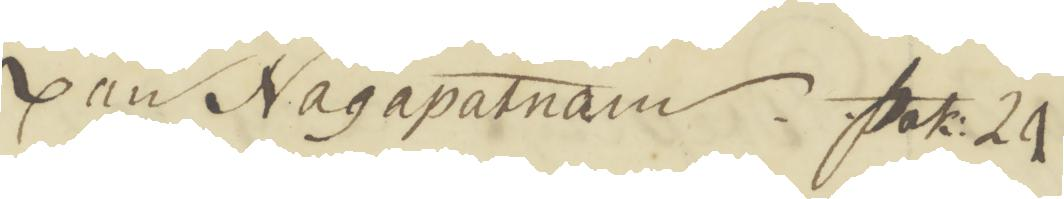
van Nagapatnam - pak: 24
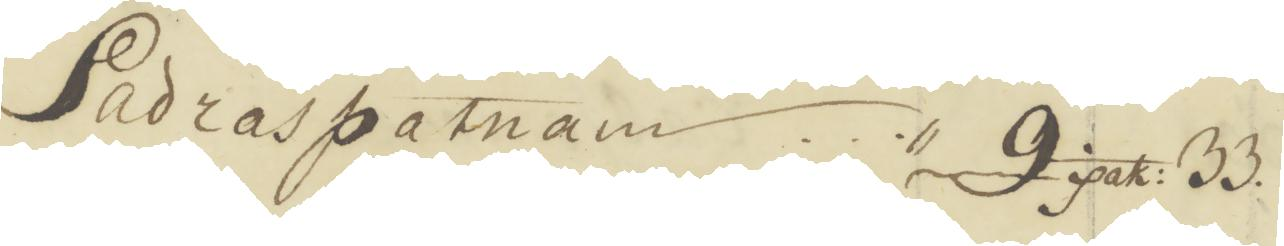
Sadraspatnam . . . „ 9: pak: 33:
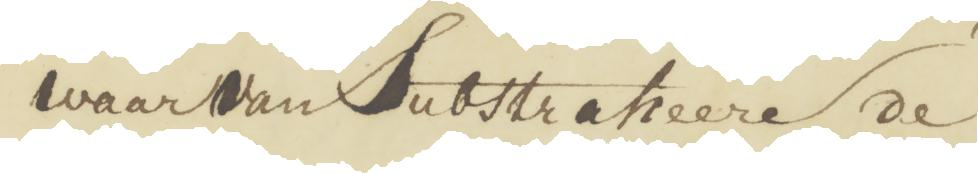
waar van Substraheere de
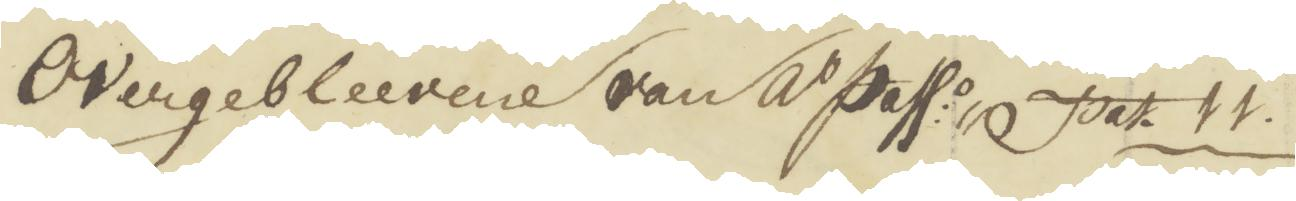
Overgebleevene van ao pass:o„ pak 11.
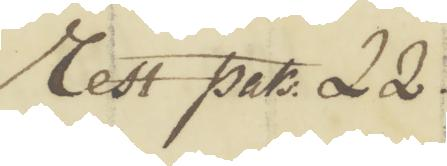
rest pak: 22
